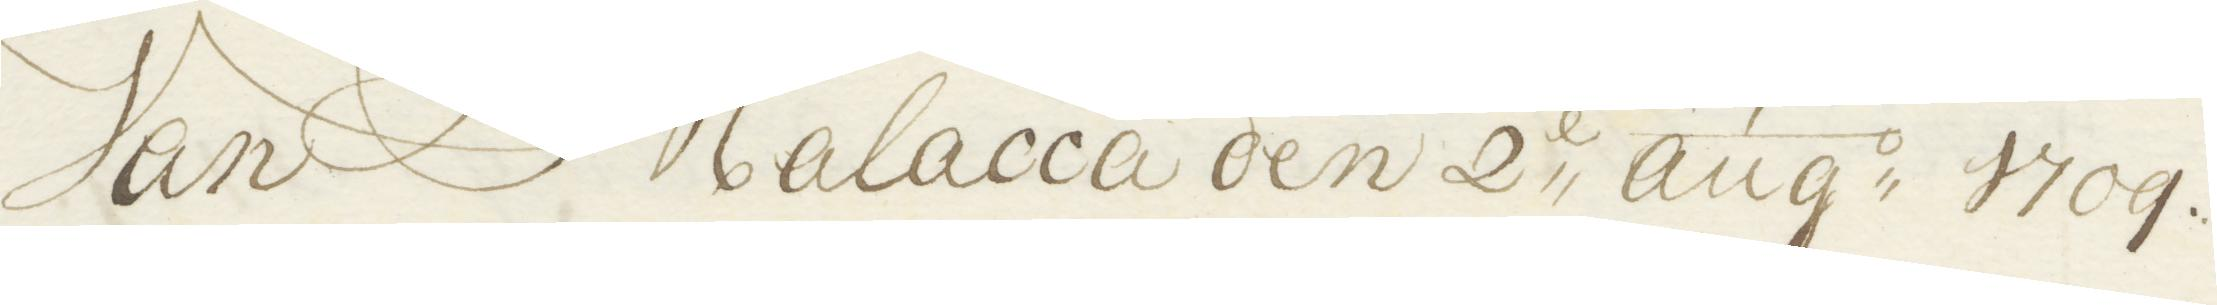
Van Malacca den 2„e aug„o 1709.
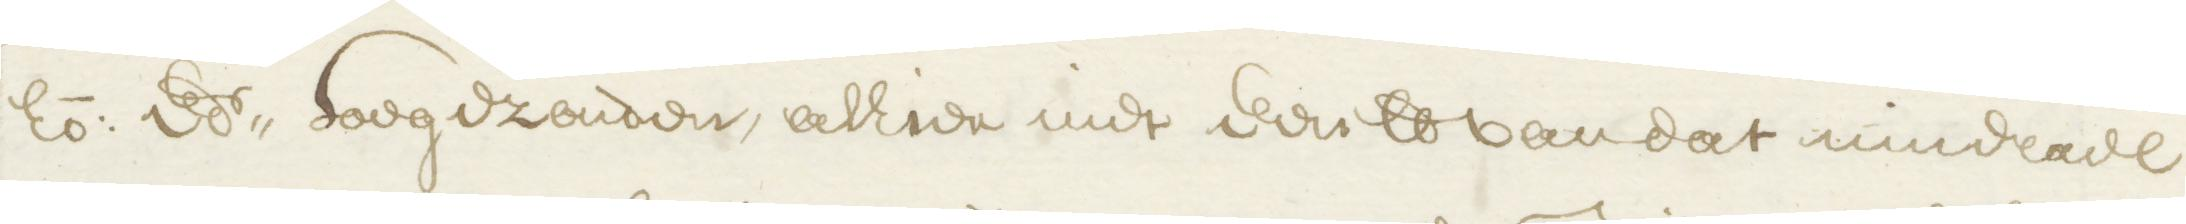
ho: Ed„s toegezonden, alhier met Een lb van dat minerael
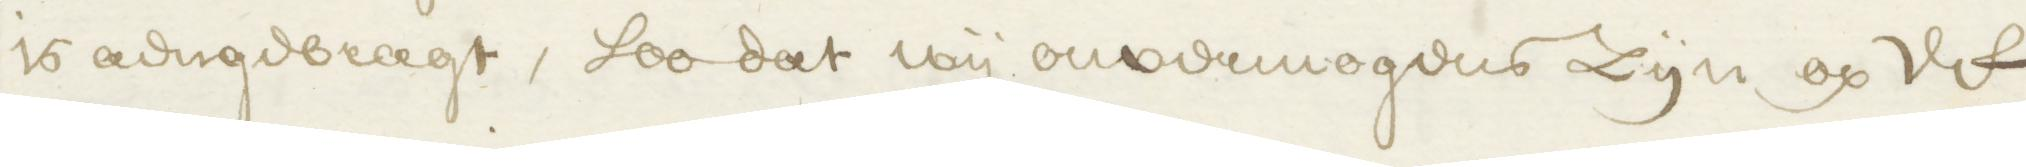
is aengebragt, soo dat wij onvermogens zijn op UE
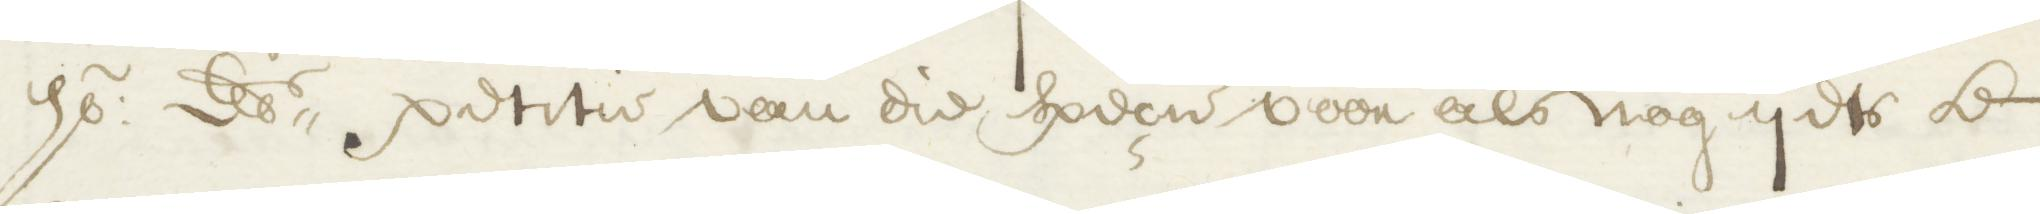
ho: Ed„s petitie van die speçie voor als nog ijets te
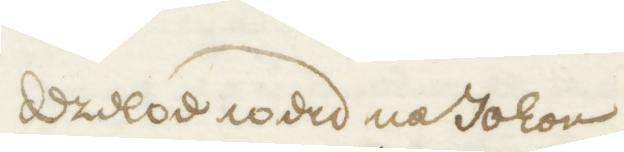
dezelve werd na Johor
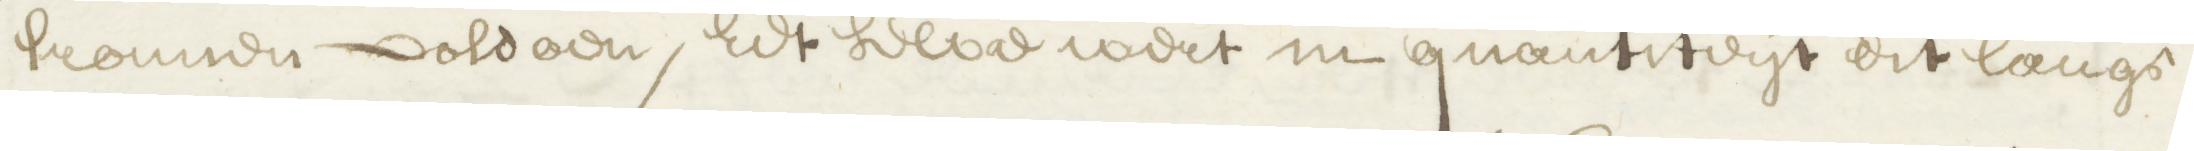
konnen voldoen, het selve wert in quantiteijt dit langs
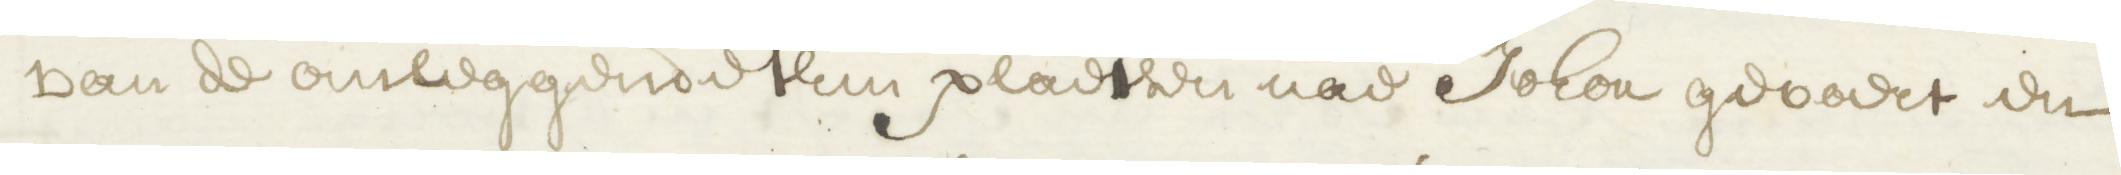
van de omleggende thin plaetsen nae Johor gevoert en
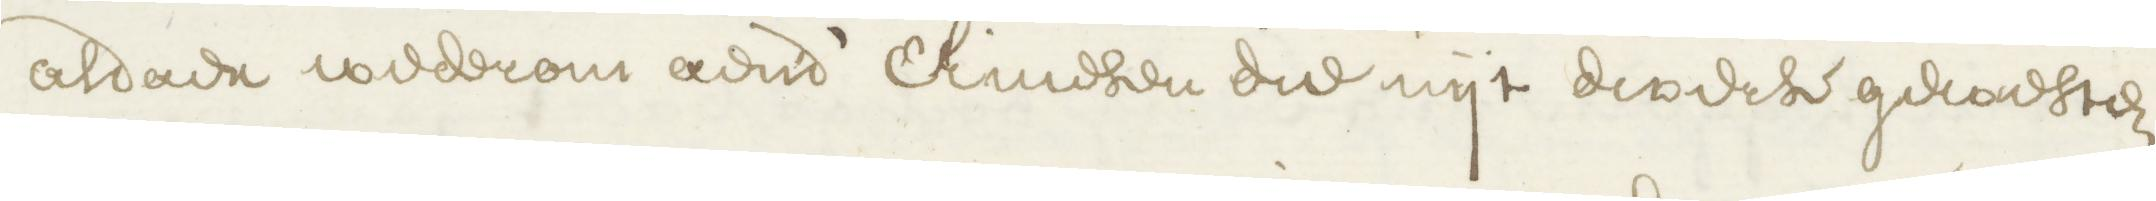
aldaer wederom aend' Chinesen die uijt diverse gewesten
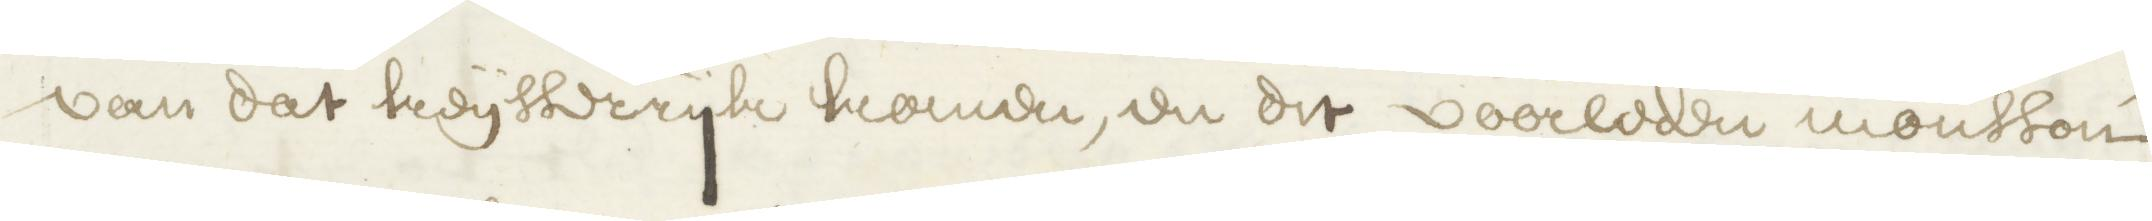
van dat keijsserrijk komen, en dit voorleden mousson
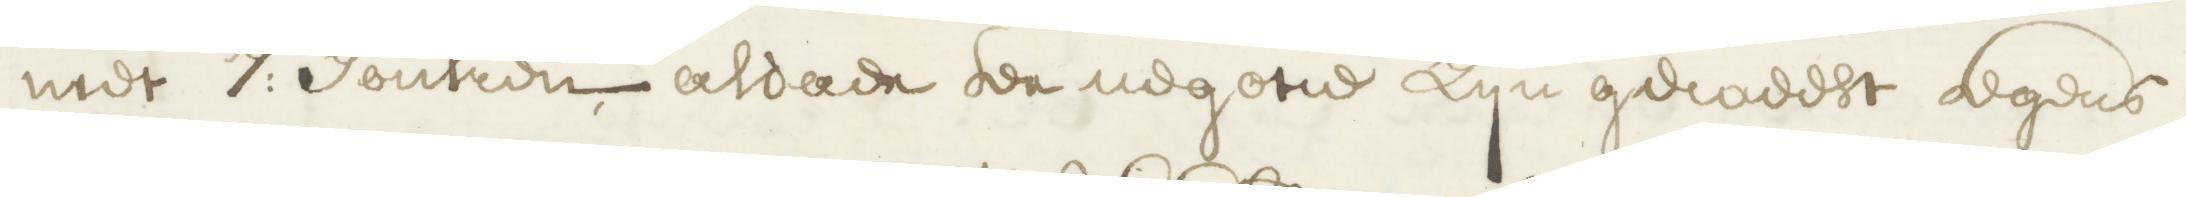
met 7: Jonken, aldaer ter negotie zijn geweest tegens
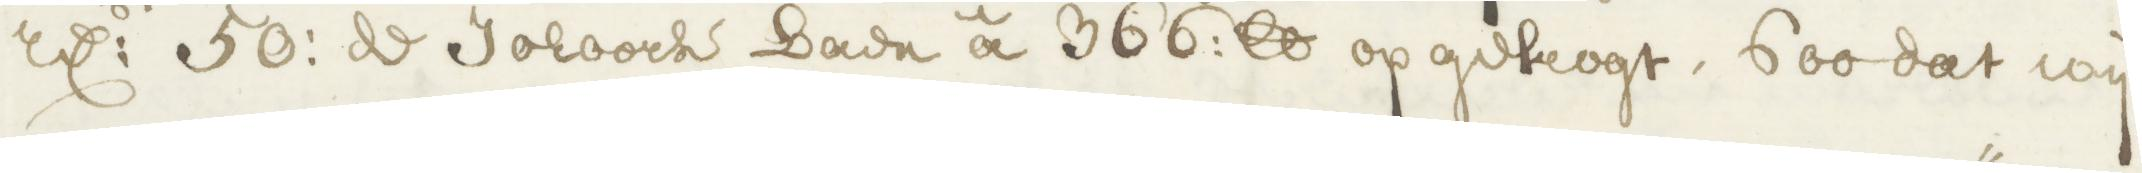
rx:s 50: de Johoorse Baer â 366: lb opgekogt, soo dat wij
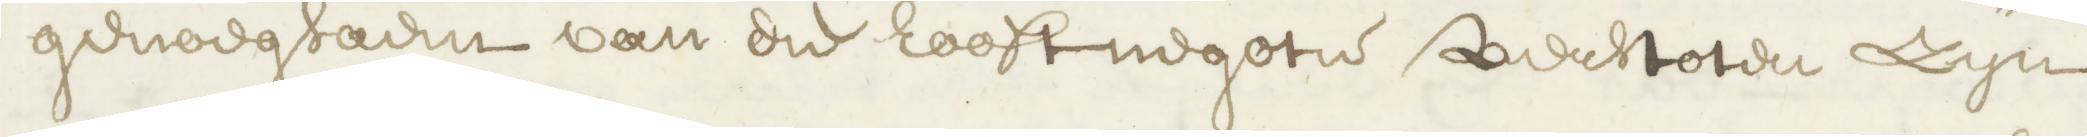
genoegsaem van die hooft negotie verstoten zijn
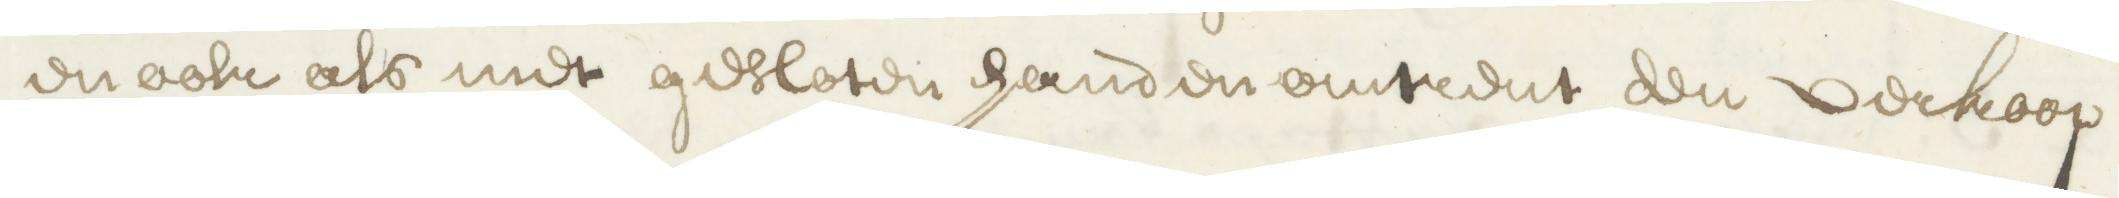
en ook als met gesloten handen omtrent den verkoop
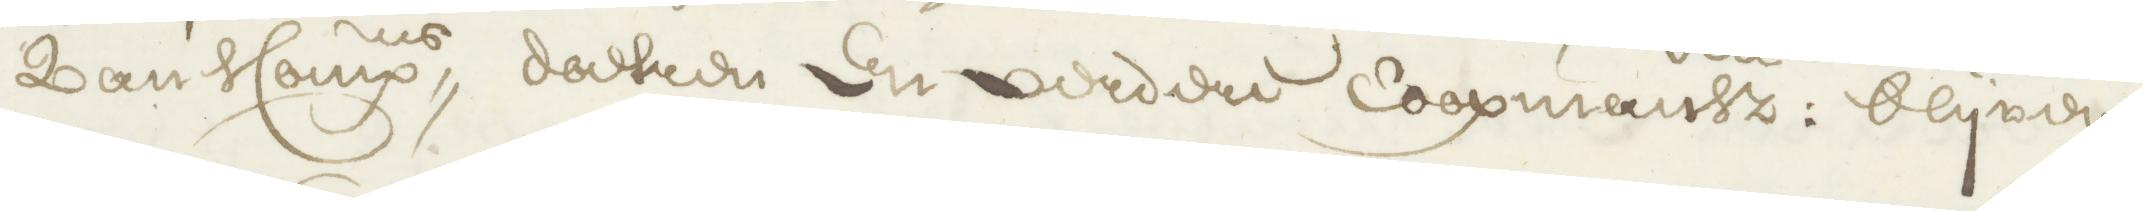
van ’sComp„s doeken En verdere Coopmansz: blijven
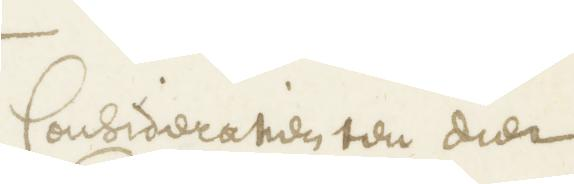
Consideratien ten dien
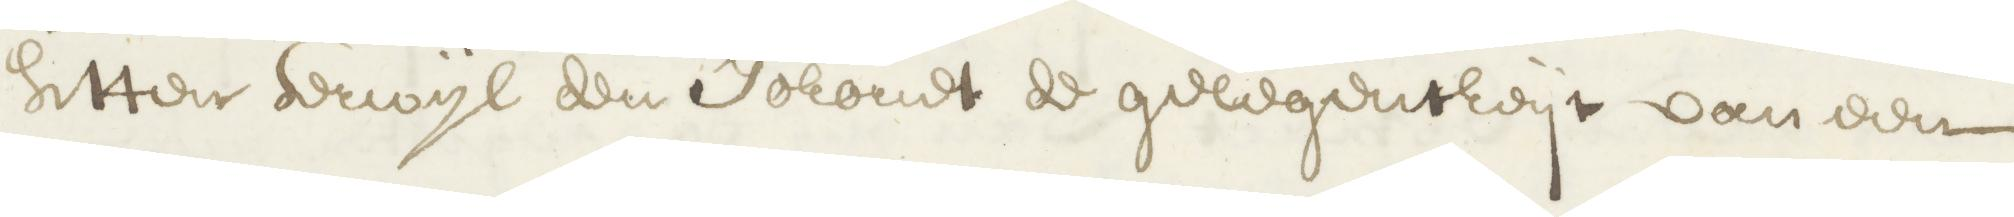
sitten terwijl den Johoriet de gelegentheijt van een
